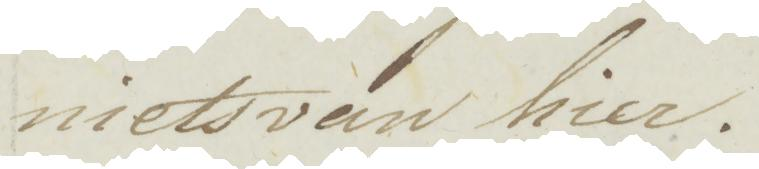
niets van hier.
